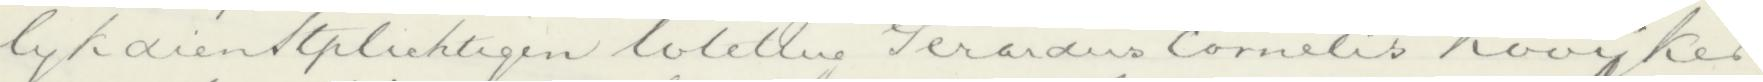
lyk dienstplichtigen loteling Gerardus Cornelis Kooyker
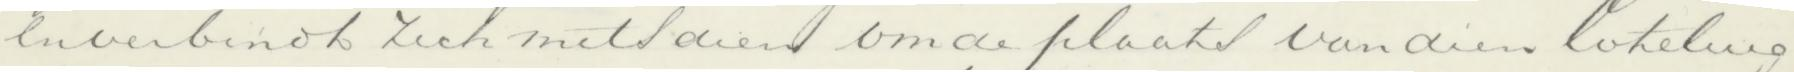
en verbindt zich mitsdien om de plaats van dien loteling
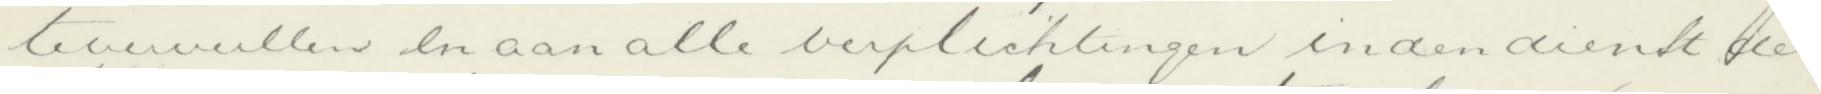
te vervullen en aan alle verplichtingen in den dienst der
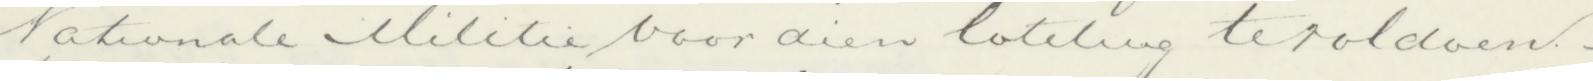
Nationale Militie, voor dien loteling te voldoen.
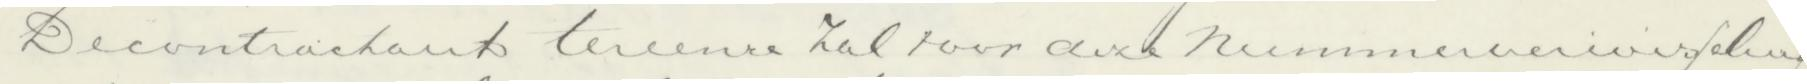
De contractant tereenre zal voor deze Nummerverwisseling
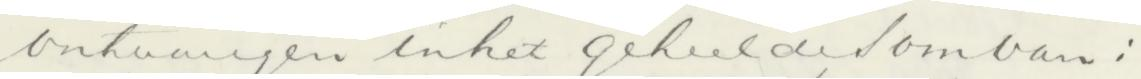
ontvangen in het geheel de som van:
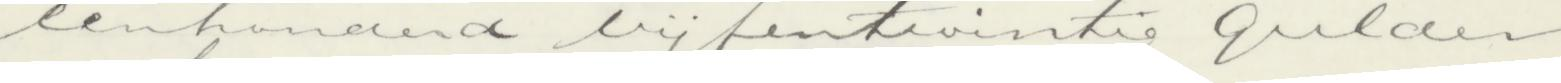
een honderd vijfentwintig Gulden
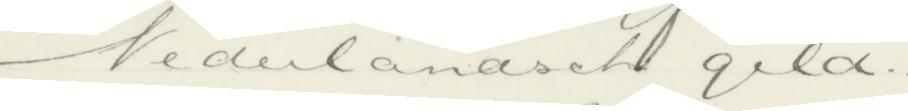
Nederlandsch geld.
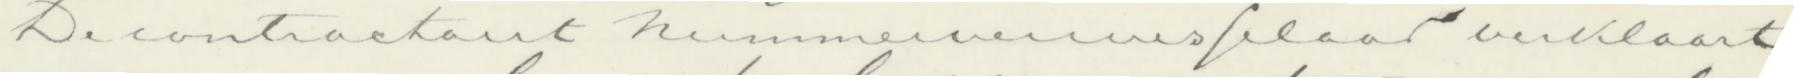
De contractant Nummerverwisselaar verklaart
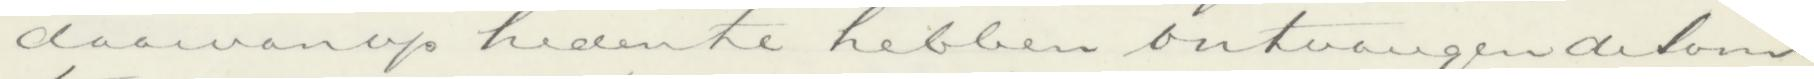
daarvan op heden te hebben ontvangen de som
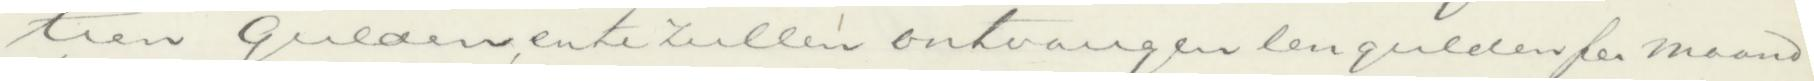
tien Gulden, en te zullen ontvangen een gulden per maand
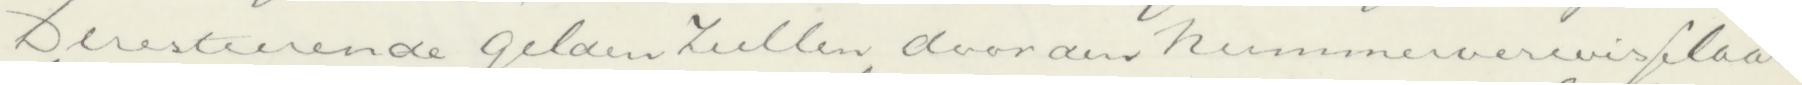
Deresteerende gelden zullen door den Nummerverwisselaar
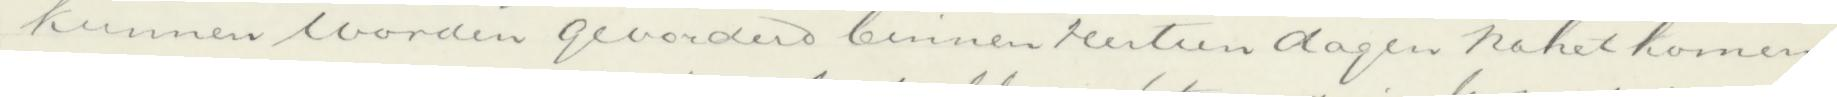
kunnen worden gevorderd binnen veertien dagen na het komen
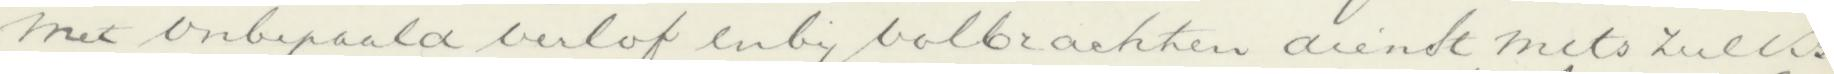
met onbepaald verlof en bij volbrachten dienst mits zulks
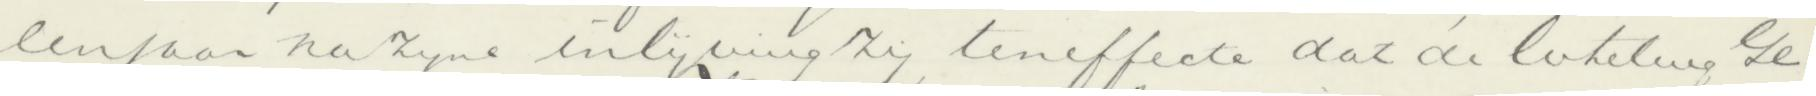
een jaar na zyne inlijving zij ten effecte dat de loteling Ge
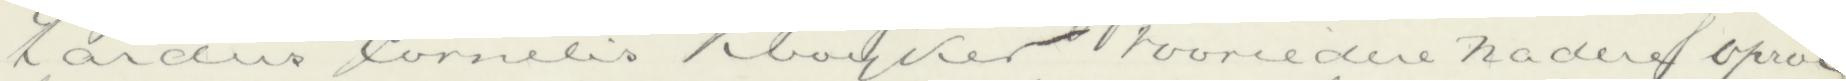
rardus Cornelis Kooyker voor iedere nadere oproe
